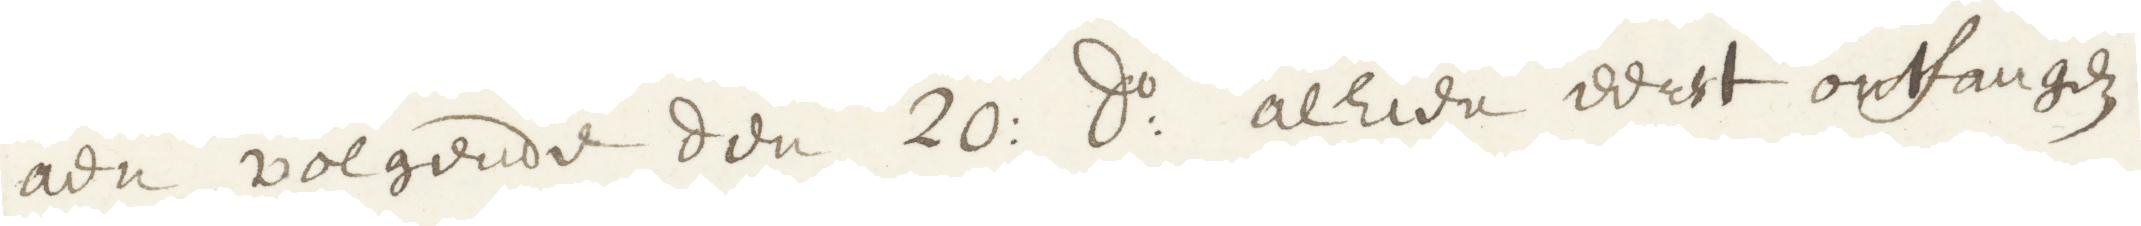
aen volgende den 20: d:o alhier eerst ontfangen
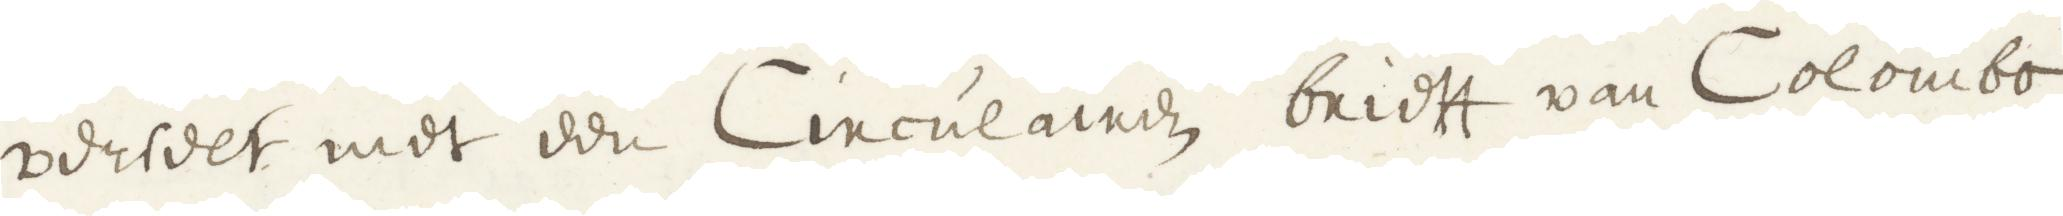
verselt met een Circulairen brieff van Colombo
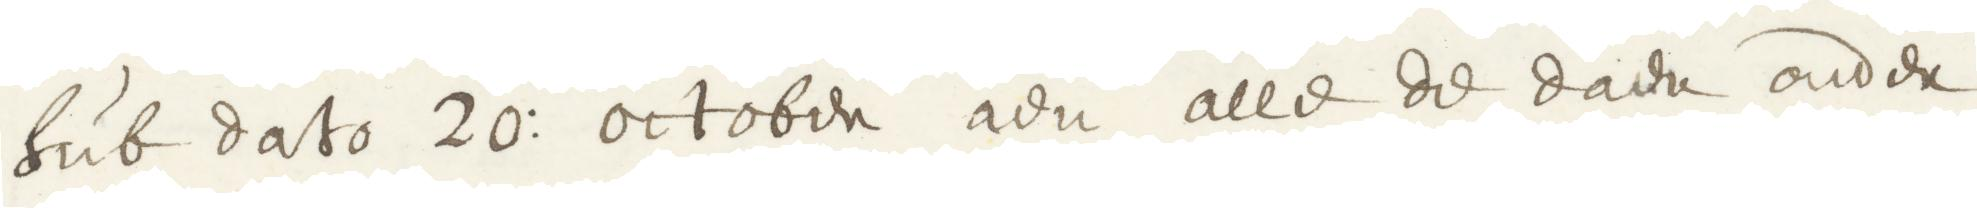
sub dato 20: october aen alle de daer onder
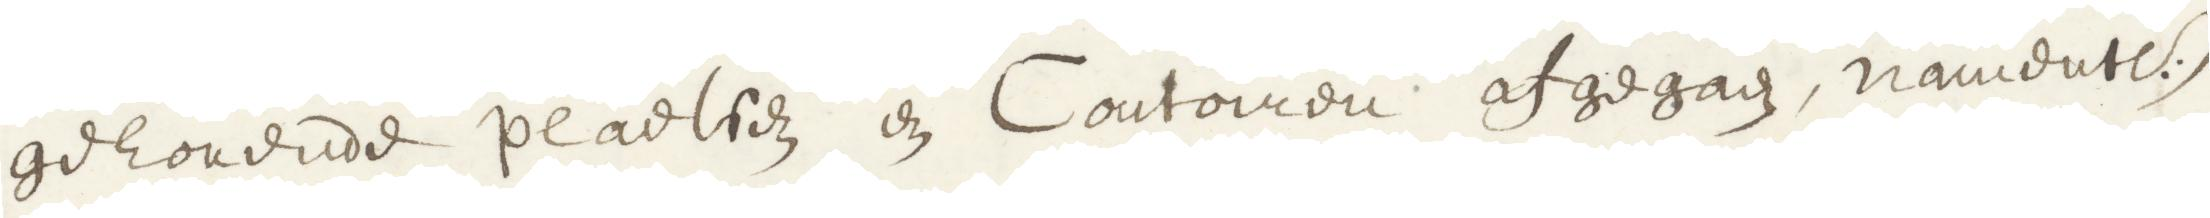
gehorende plaetsen en Contoiren afgegaen, namentlijk
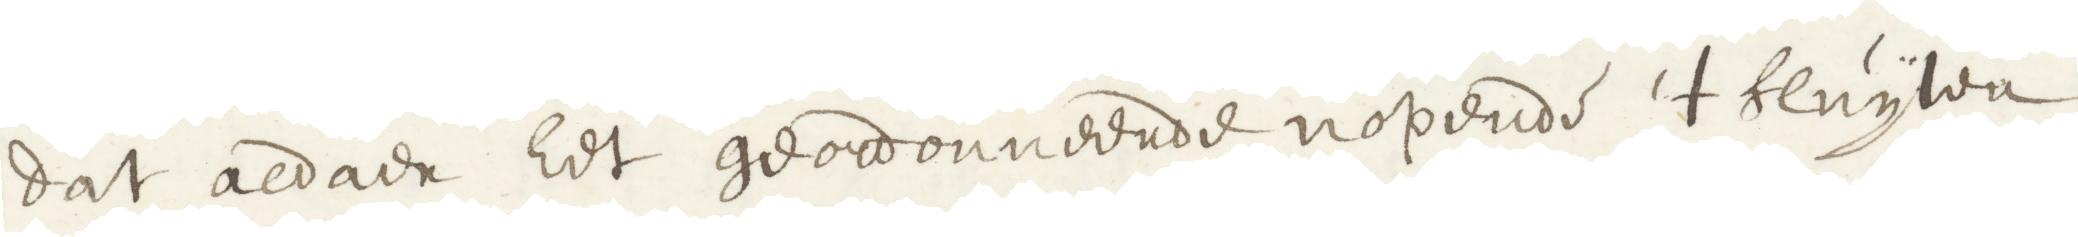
dat aldaer het geordonneerde nopende ’t sluijten
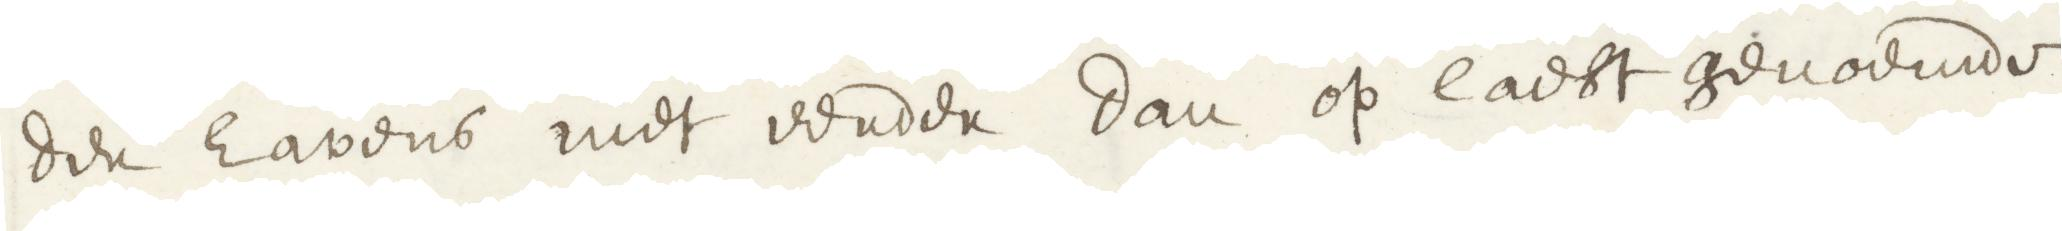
der havens niet eerder dan op laest genoemde
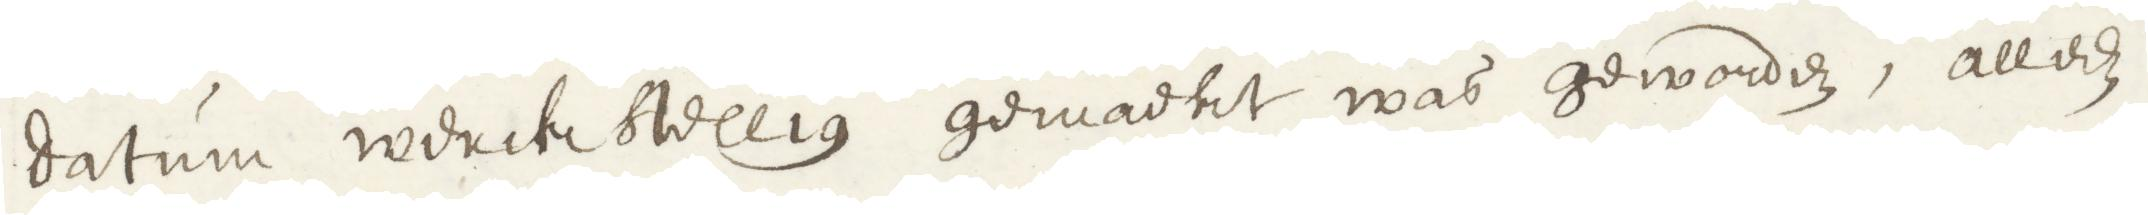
datum werckstellig gemaekt was geworden, alleen
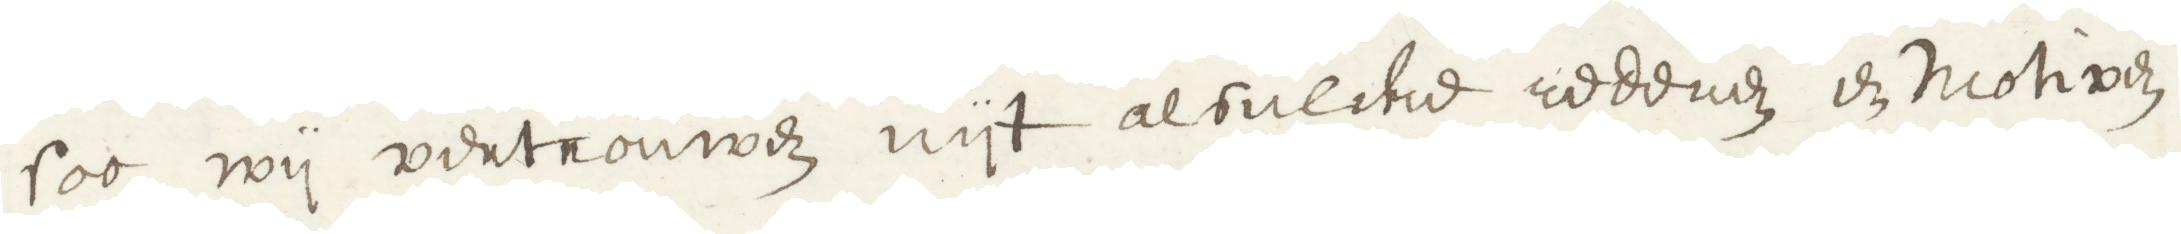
soo wij vertrouwen uijt al sulcke redenen en motiven
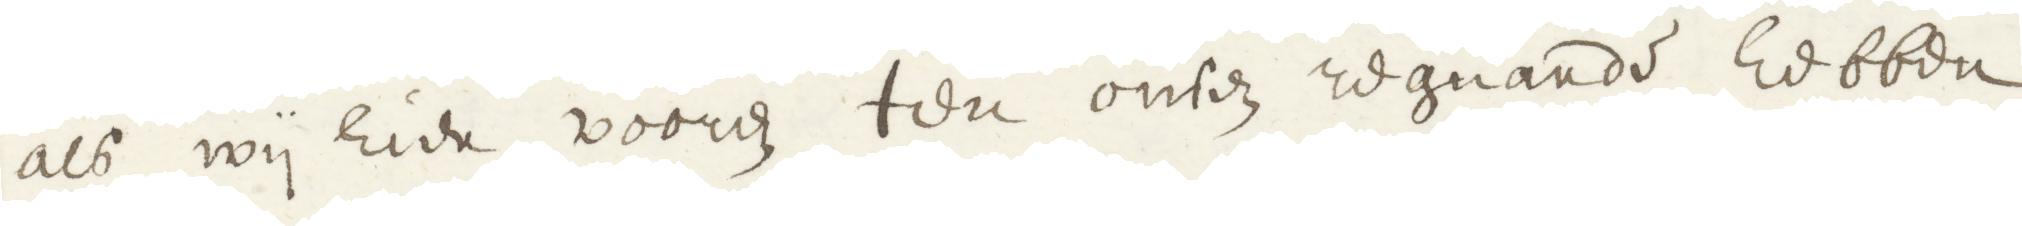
als wij hier vooren ten onsen reguarde hebben
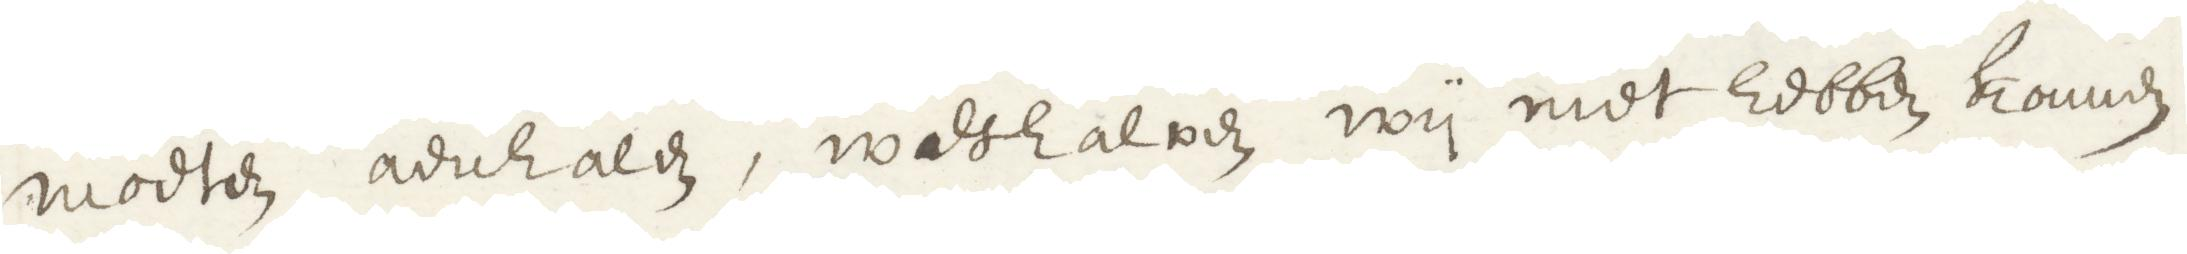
moeten aenhalen, weshalven wij niet hebben konnen
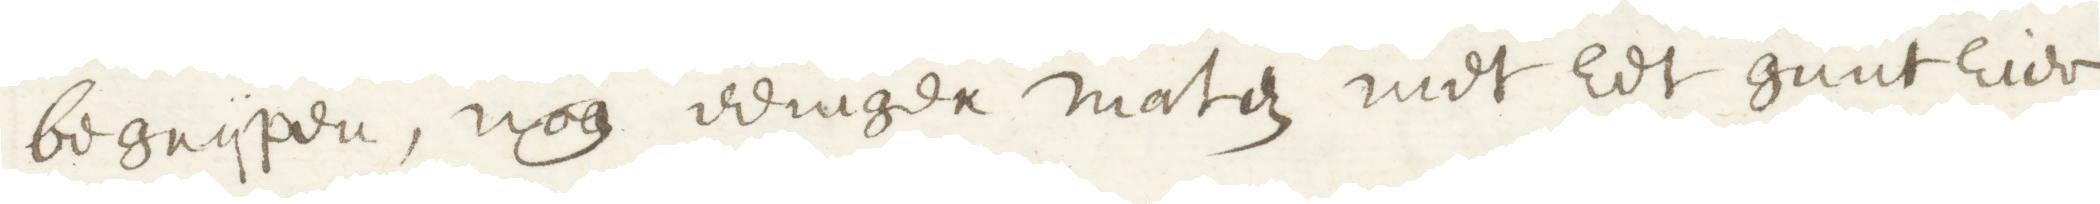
begrijpen, nog eeniger maten met het gunt hier
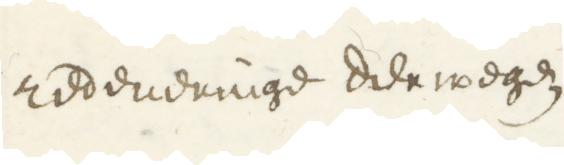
redeneringe der wegen
